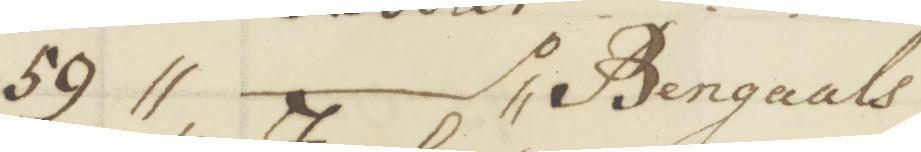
59„ d„o Bengaals
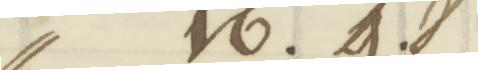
„ 16.4.8
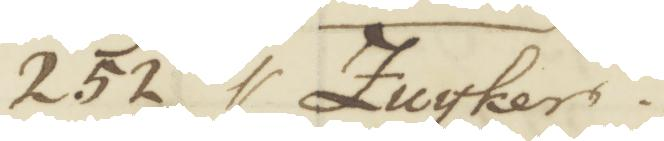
252 „ Zuijker
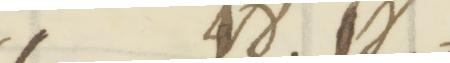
„ 18.18.
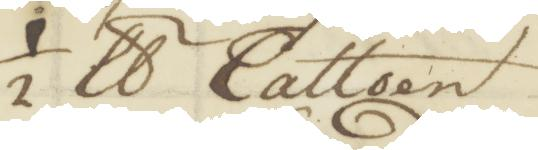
½ lb Cattoen
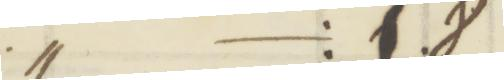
-„ —: 1.8
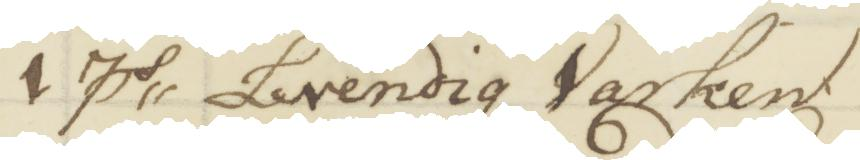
1 P„s Levendig Varken
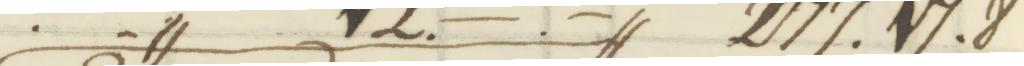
-„ 12:—:—„ 277.17.8
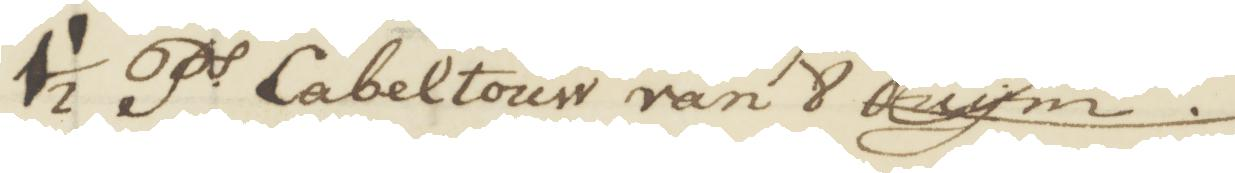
1½ P.s Cabeltouw van 8 duijm
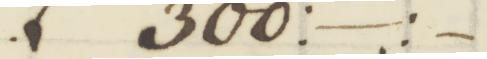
-1 300:—:—
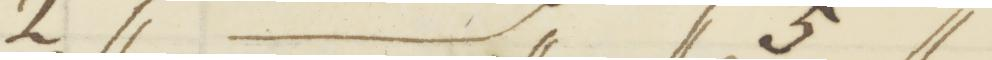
2 „ d„o „ 5 „
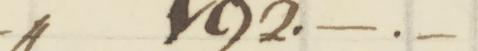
„ 192.—.—
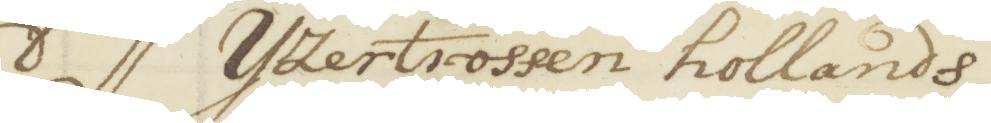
8 „ Yzertrossen hollands
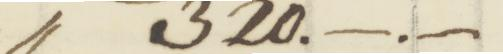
„ 320.—.—
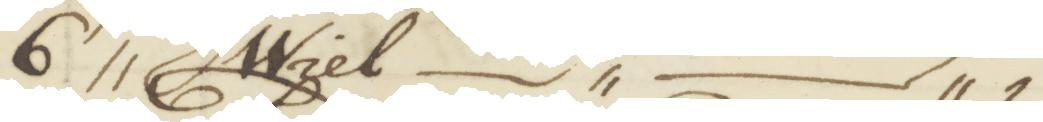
6 „ Wiel d„o d„o,
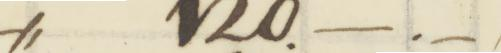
„ 120.—.—
